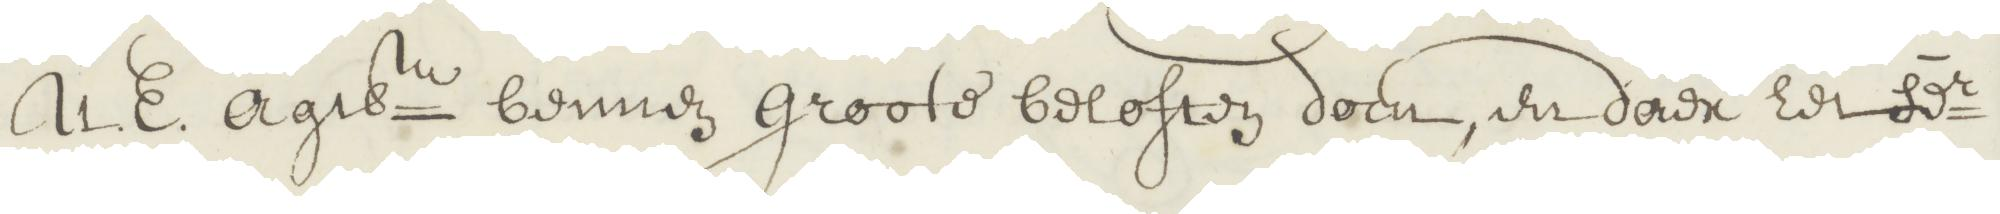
U.E. agtb=n bennen groote beloften doen, en daer het se=r
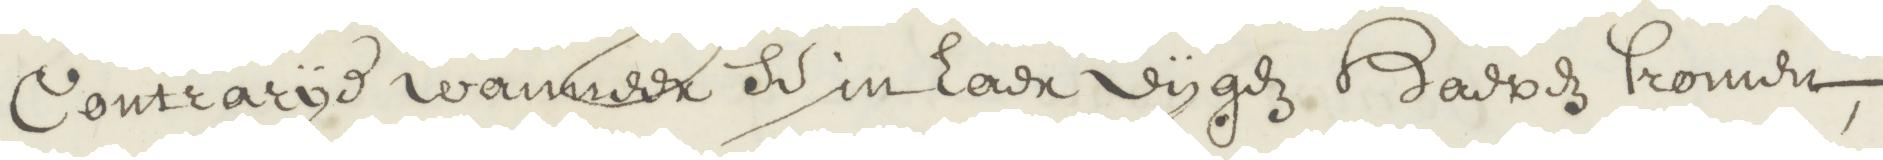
Contrarije wanneer se in haer eijgen haeven komen,
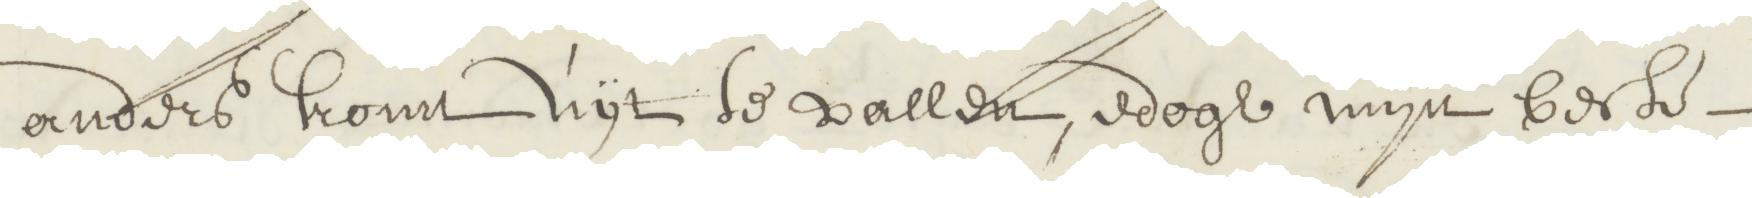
anders komt uijt te vallen, edogh mijn beste —
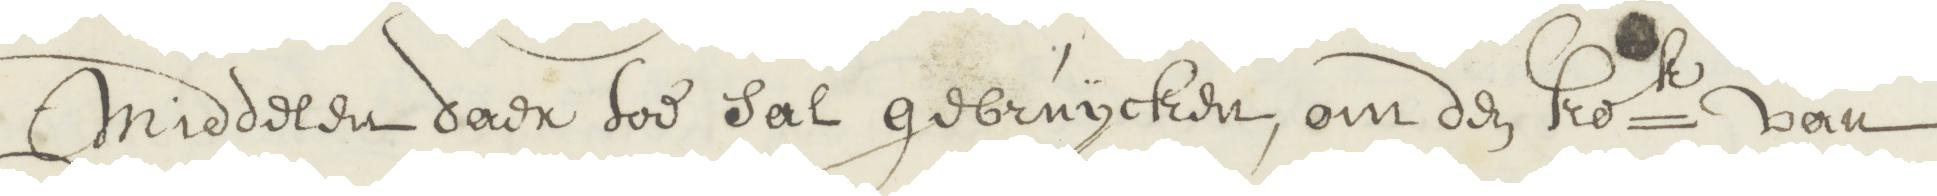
middelen daer toe sal gebruijcken, om den ko=k van
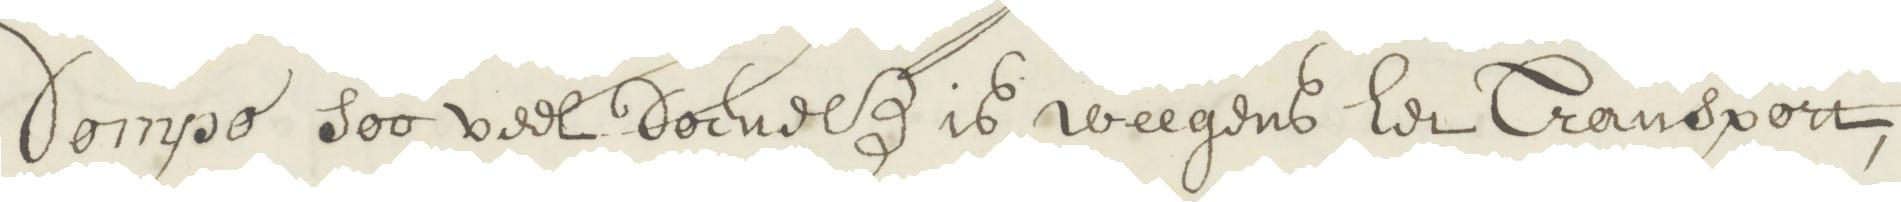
dompo soo veel doenelijk is weegens het Transport,
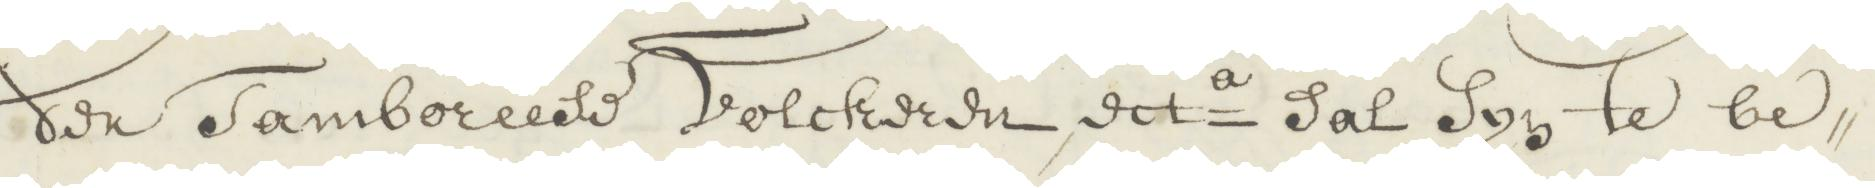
der Tamboreese Volckeren, ect=a sal sijn te be„
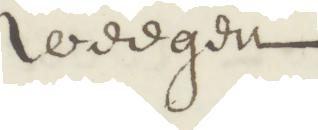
weegen
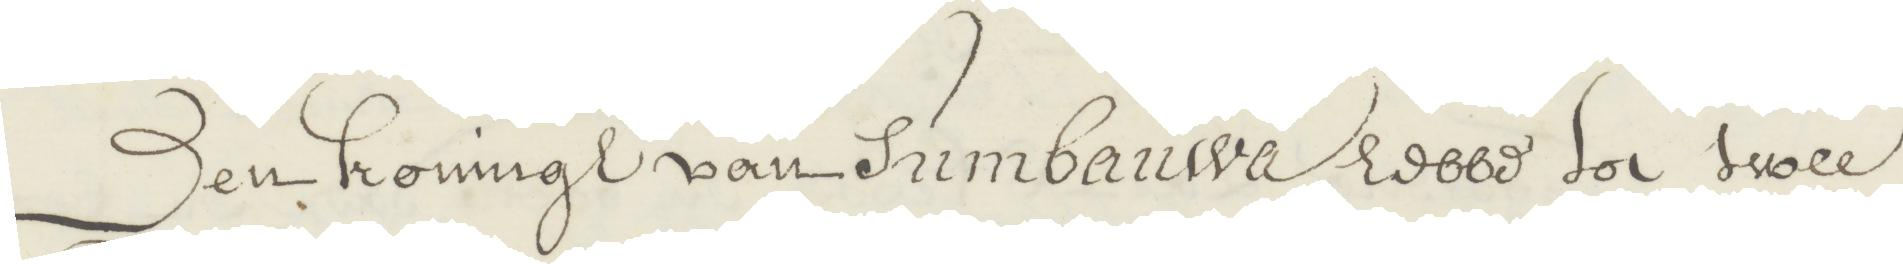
Den koningh van Sumbauwa hebbe tot twee
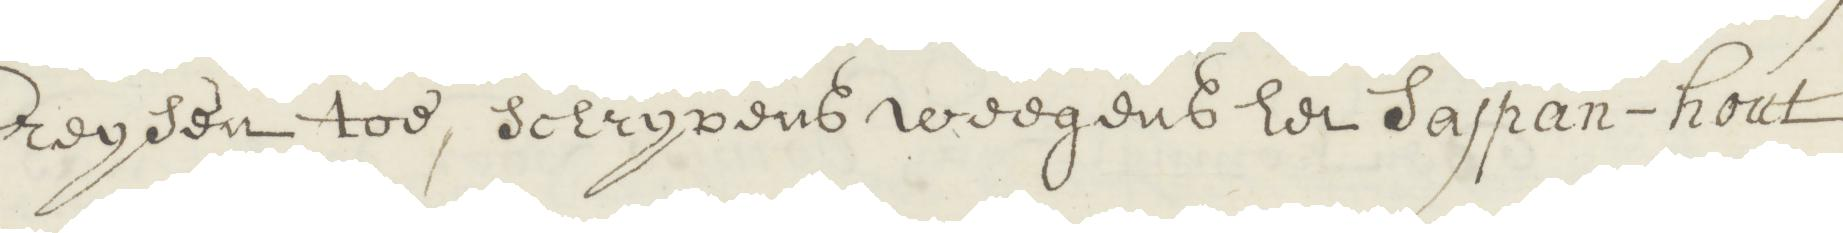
reysen toe, schryvens weegens het sappan-hout
